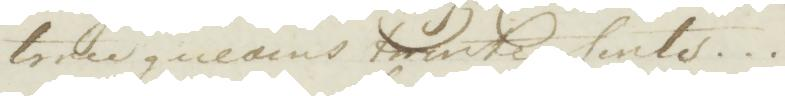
twee guldens twintig Cents . . .
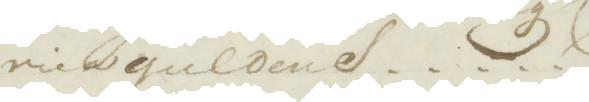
vier guldens . . . . . . . . . . . .
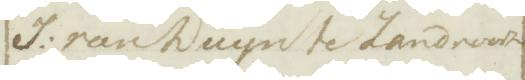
J. van Duyn te Zandvoort
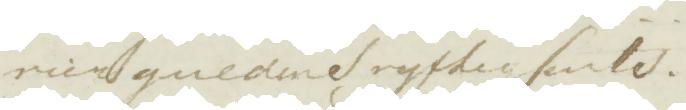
vier guldens vyftig Cents . . . . .
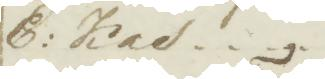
E: Kas . . . . . . . . . .
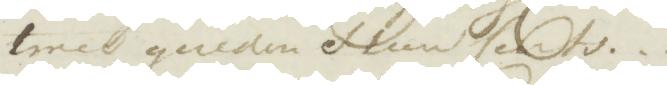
twee guldens tien Cents . . . . . . .
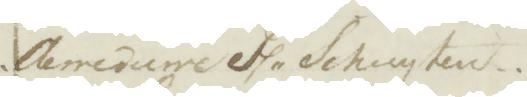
de weduwe F„ Schuyten .
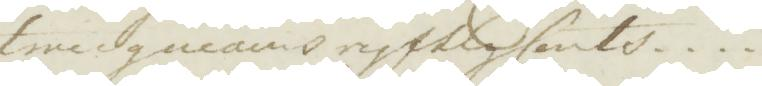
twee guldens vyftig Cents . . . . . .
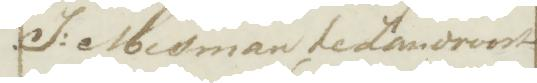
J: Mesman te Zandvoort
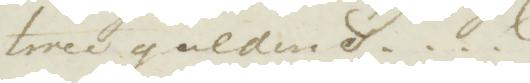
twee guldens . . . . . . . . . . . . .
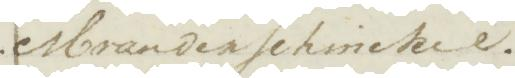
M van der schinckel.
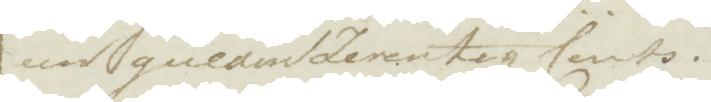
een gulden zeventig Cents. . . . .
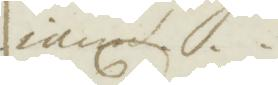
idem. . . . . . . . .
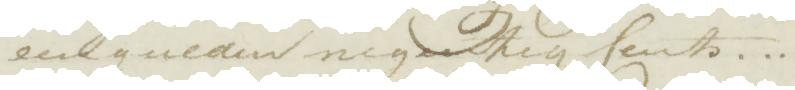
een gulden negentig Cents . . .
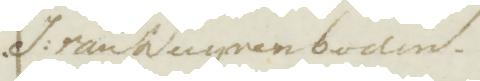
J: van Duyvenboden . . .
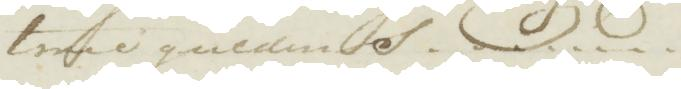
twee guldens . . . . . . . . . . . .
